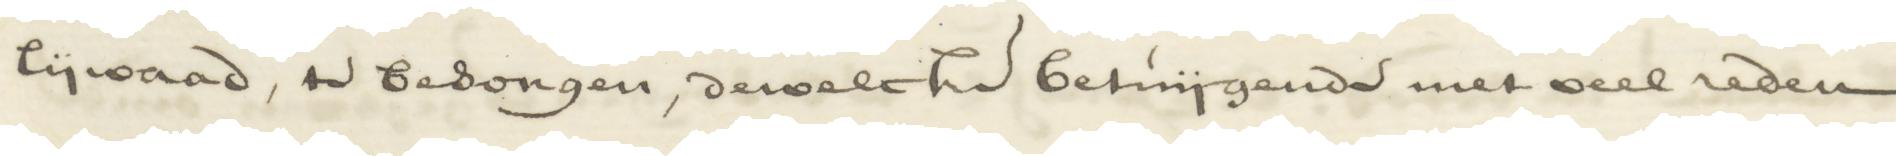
lijwaad, te besorgen, dewelcke betuijgende niet veel reden,
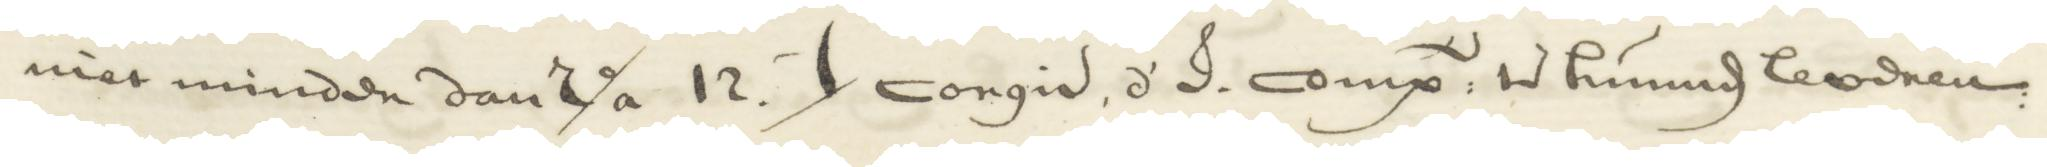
niet minder dan r o/a 12. 't corgie, d’ E. comp: te kunnen leveren:
